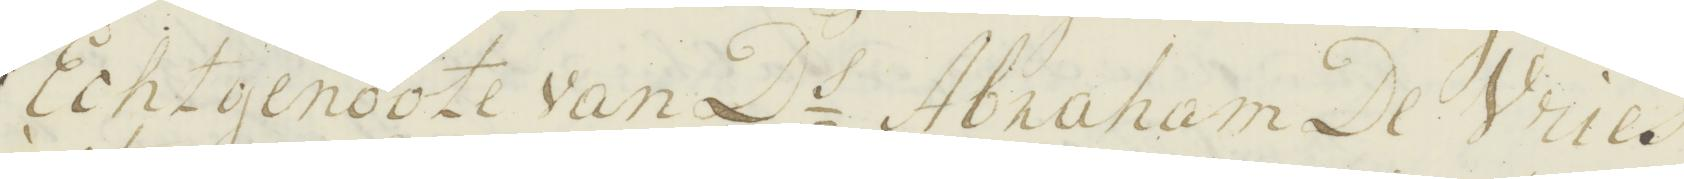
Echtgenoote van D=s Abraham De Vries
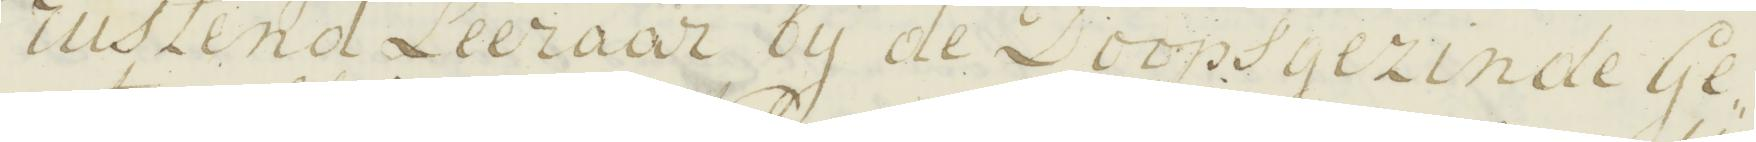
rustend Leeraar bij de Doopsgezinde Ge„
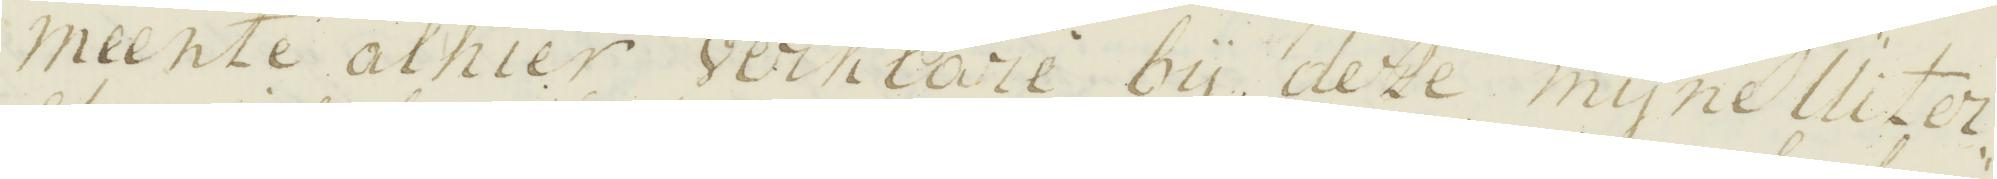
meente alhier verklare bij deze myne Uiter„
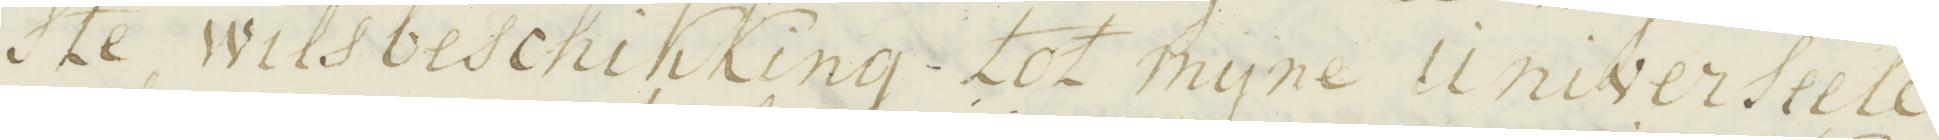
ste wilsbeschikking tot mijne universeele
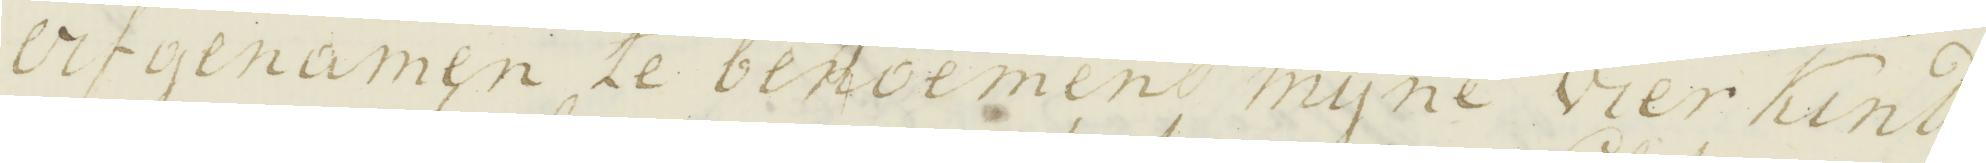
erfgenamen te benoemen myne vier kinde
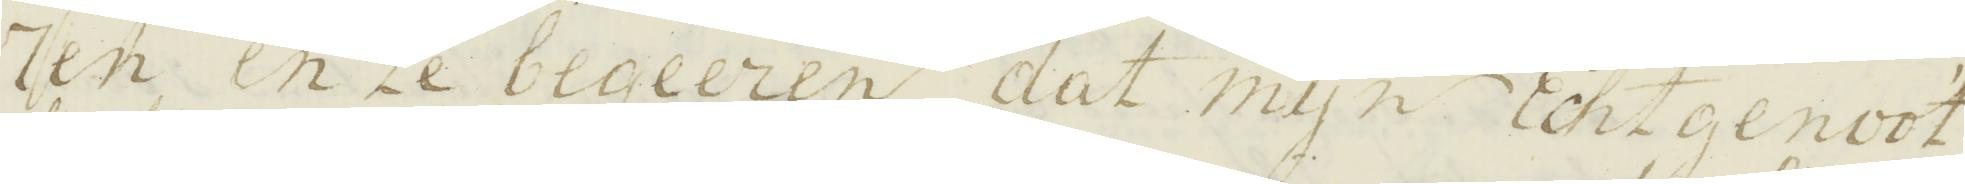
ren en te begeeren dat mijn Echtgenoot
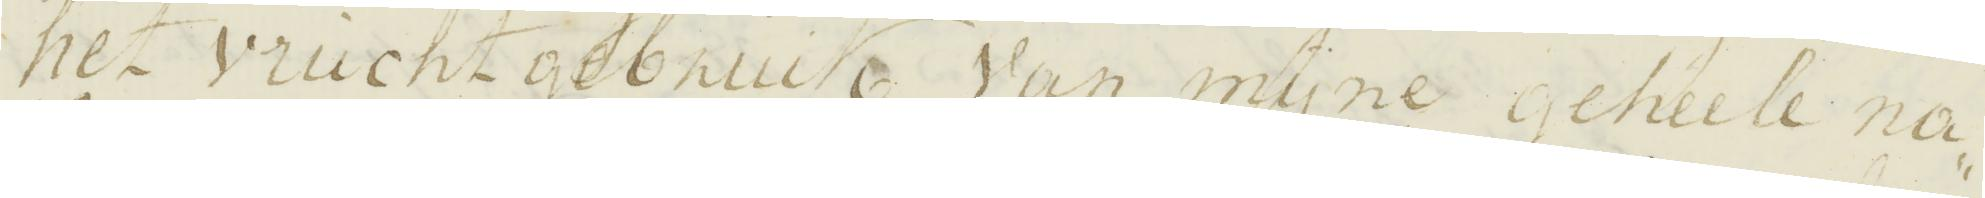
het vruchtgebruik van mijne geheele na„
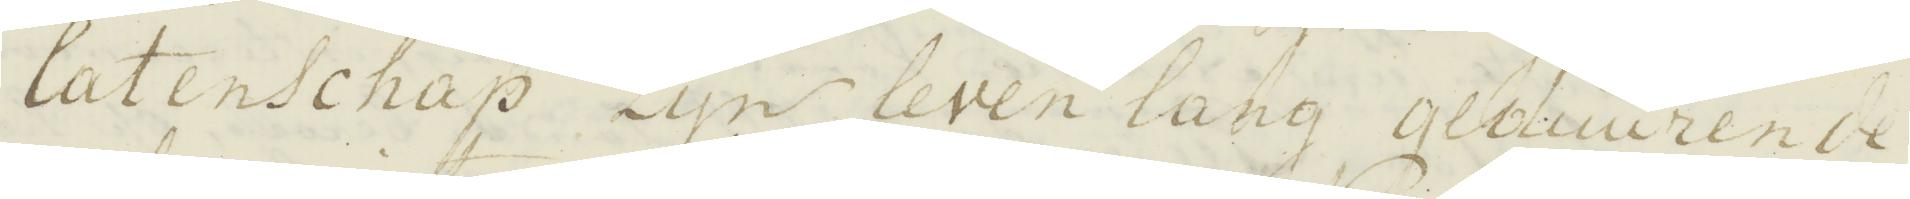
latenschap zijn leven lang geduurende
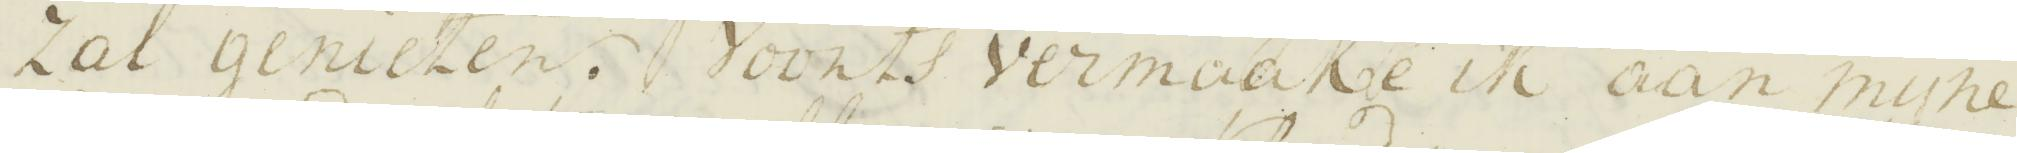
zal genieten. Voorts vermaake ik aan myne
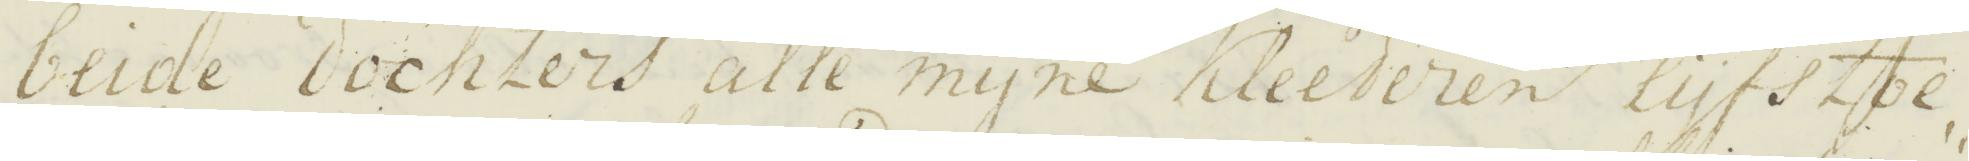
beide dochters alle mijne kleederen lijfst toe
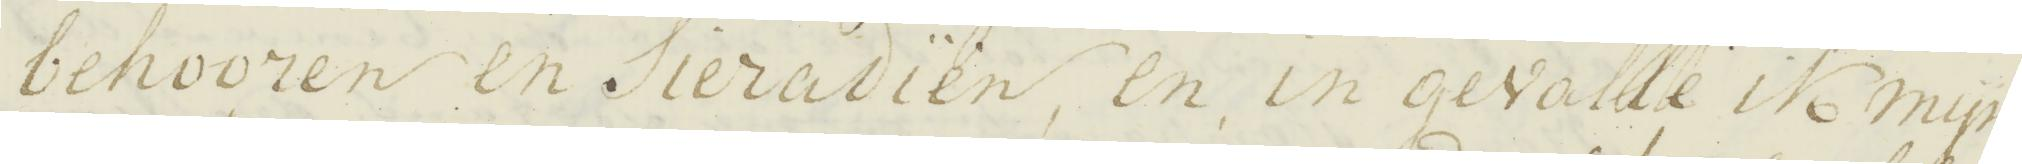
behooren en sieradiën, en, in gevalle ik mijn
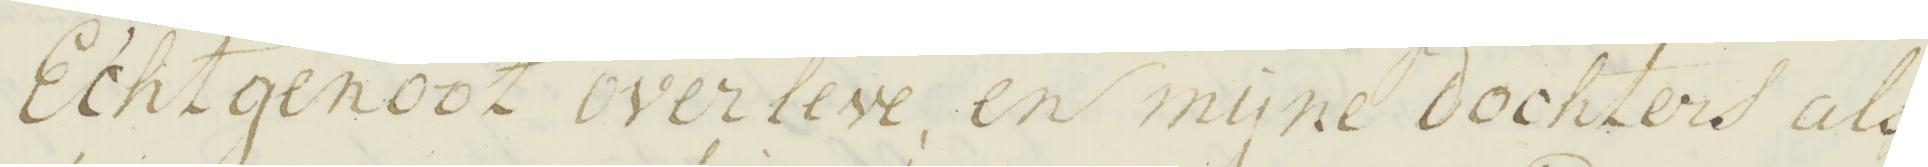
Echtgenoot overleve, en mijne dochters als
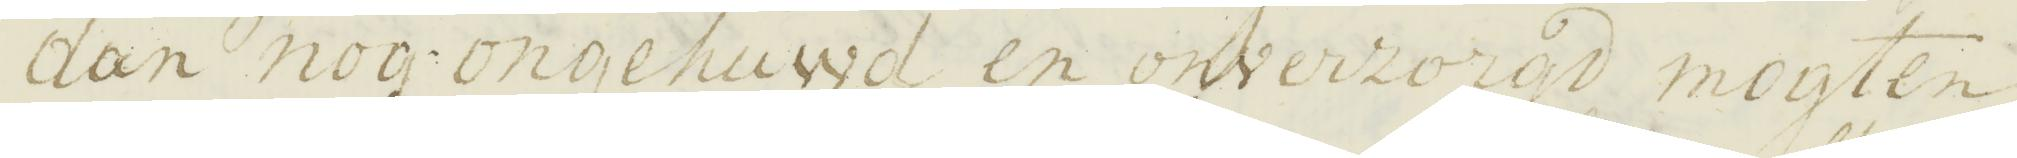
dan nog ongehuwd en onverzorgd mogten
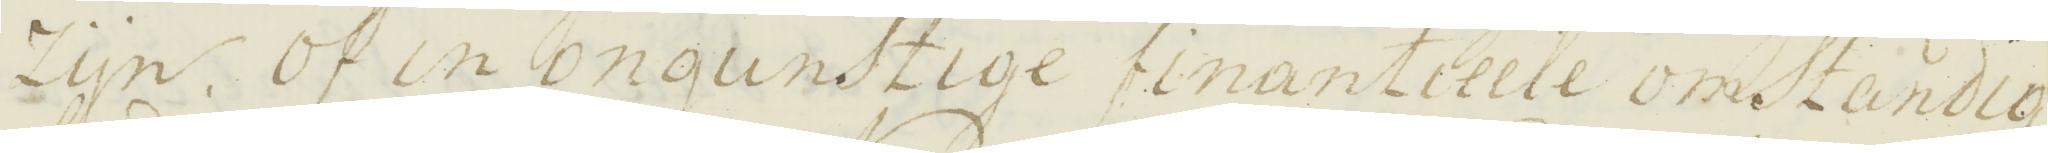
zijn, of in ongunstige finantieele omstandig
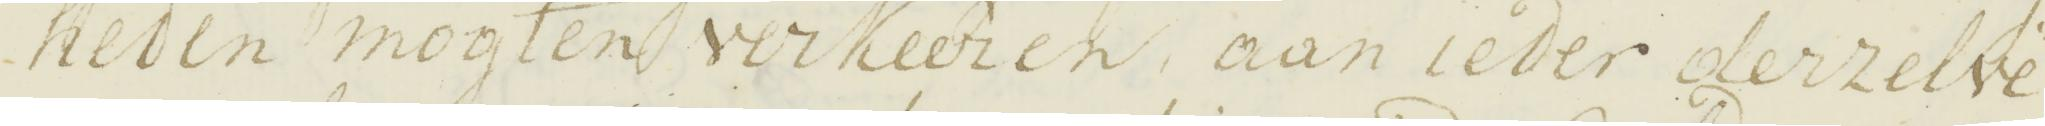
heden mogten verkeeren, aan ieder derzelve
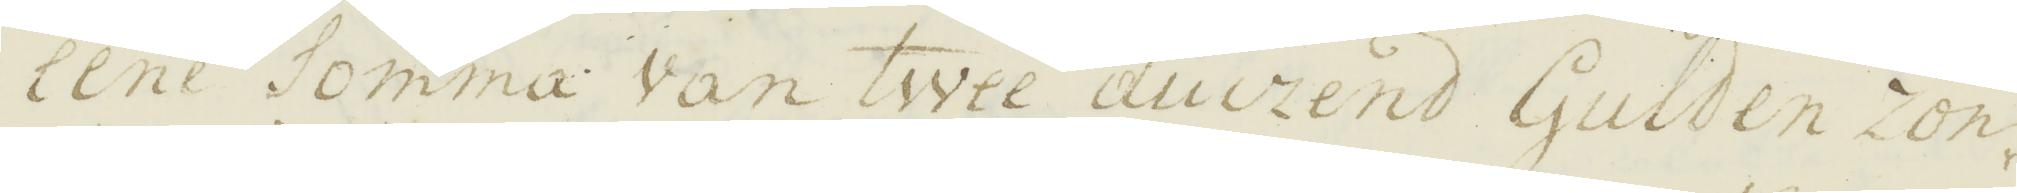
eene somma van twee duizend Gulden zon„
